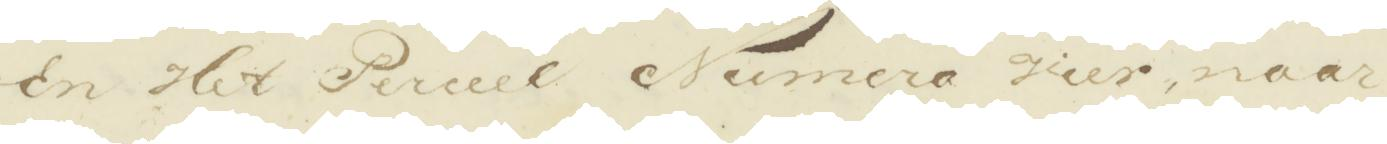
en Het Perceel Numero Vier, naar
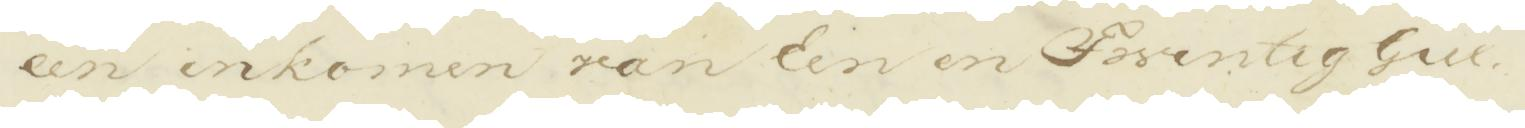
een inkomen van Een en Twintig Gul,
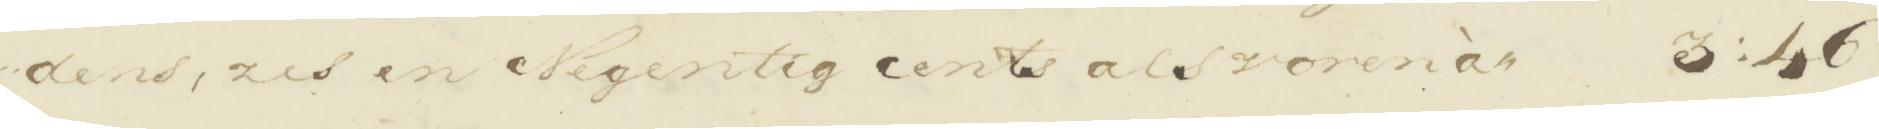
„dens, zes en Negentig cents als voren à„ 3: 46
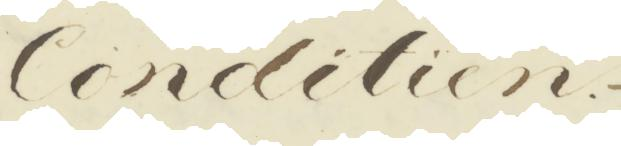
Conditien.
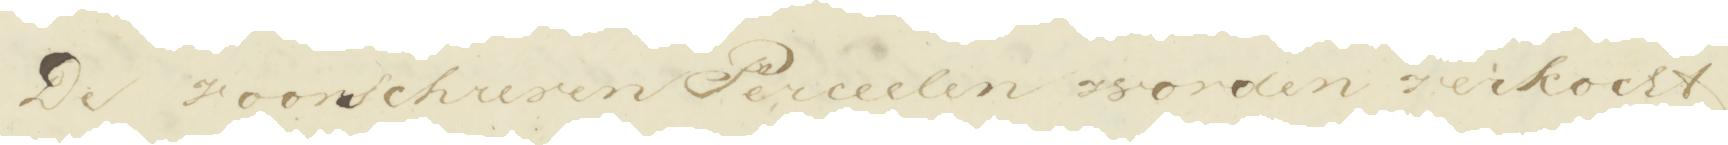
De voorschreven Perceelen worden verkocht
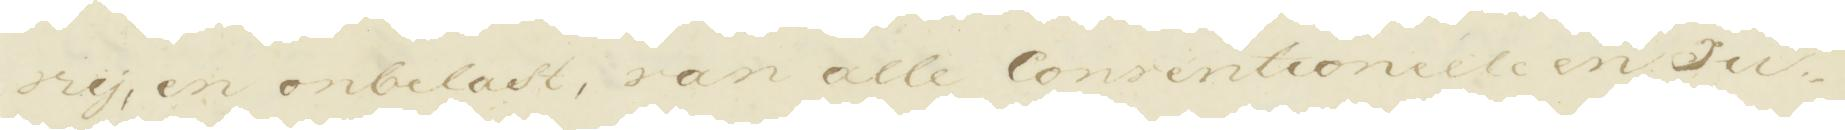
vrij, en onbelast, van alle conventioneele en In„
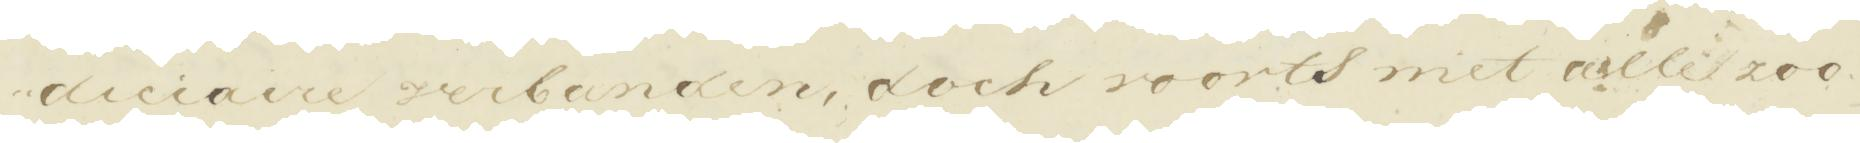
„diciaire verbanden, doch voorts met alle zoo.
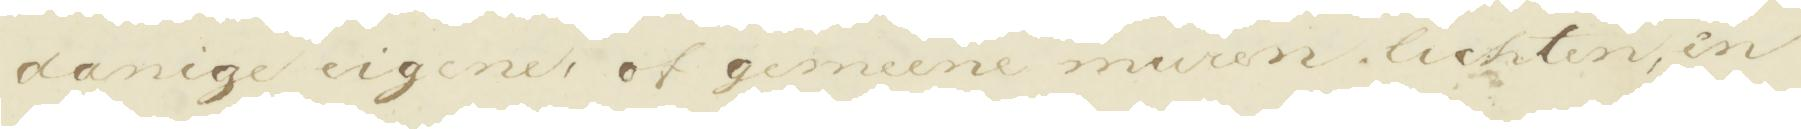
danige eigene of gemeene muren . lichten, en
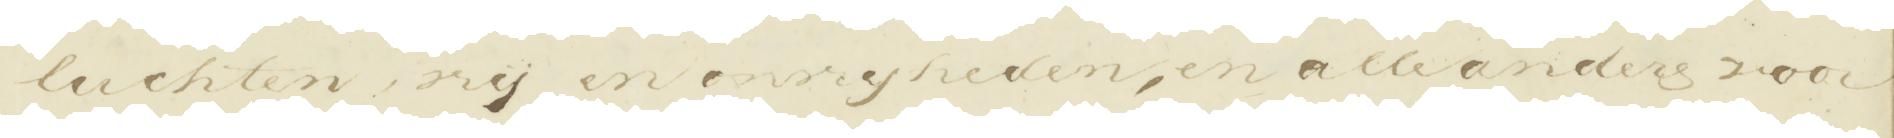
luchten, vrij en onvryheden, en alle andere voor
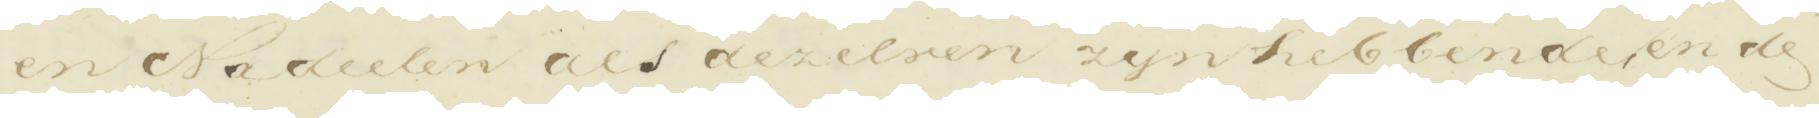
en Nadeelen als dezelven zyn hebbende, en de
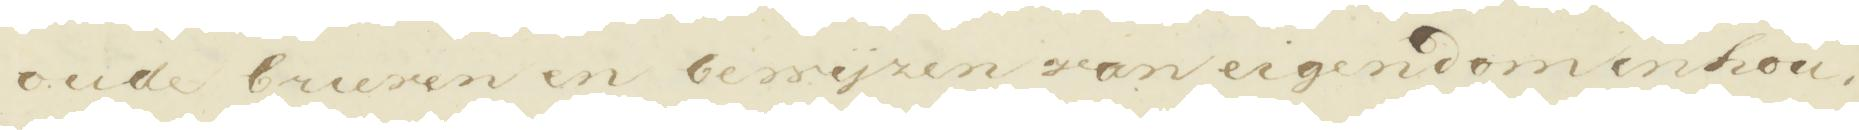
oude brieven en bewijzen van eigendom inhou,
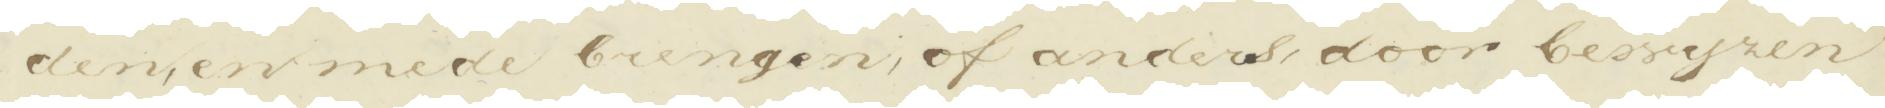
den, en mede brengen, of anders, door bewyzen
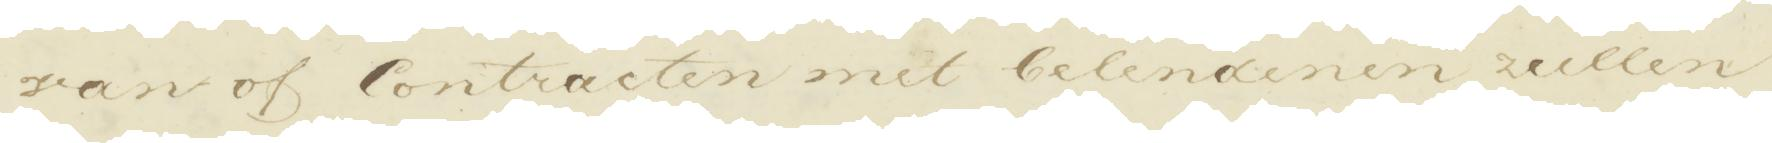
van of Contracten met belendenen zullen
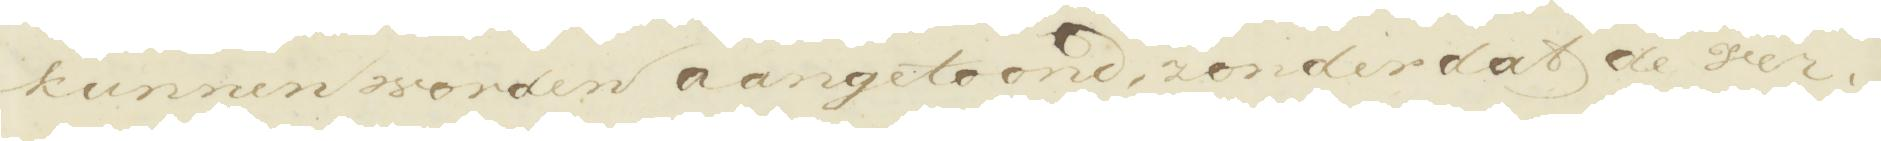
kunnen worden aangetoond, zonder dat de ver,
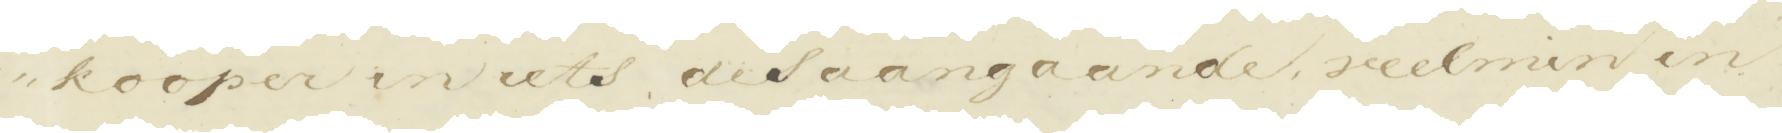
„kooper in iets, des aangaande, veelmin in
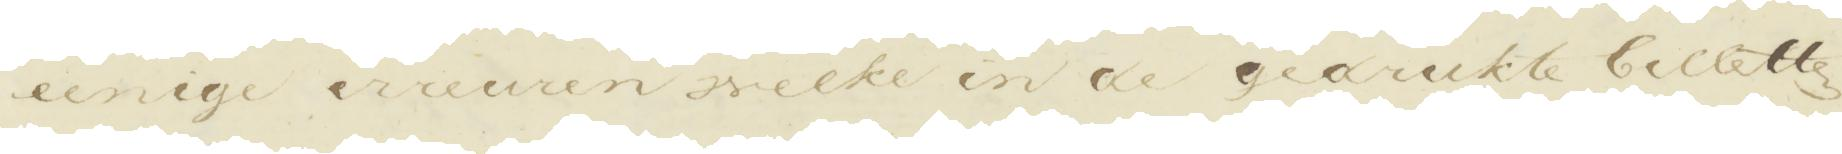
eenige erreuren welke in de gedrukte belletten
